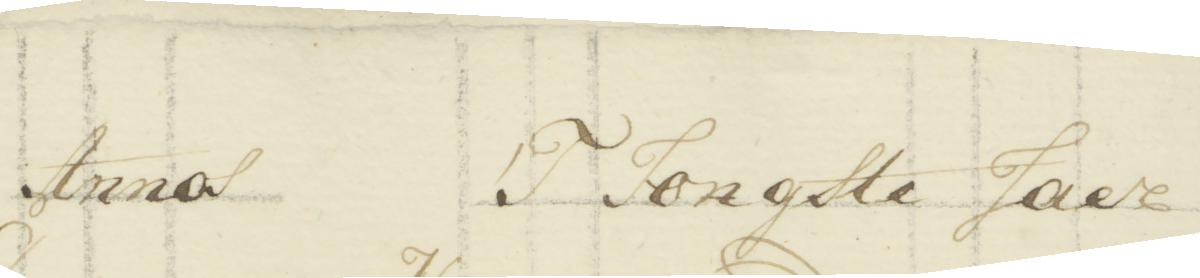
Annos 'T Iongste Jaer
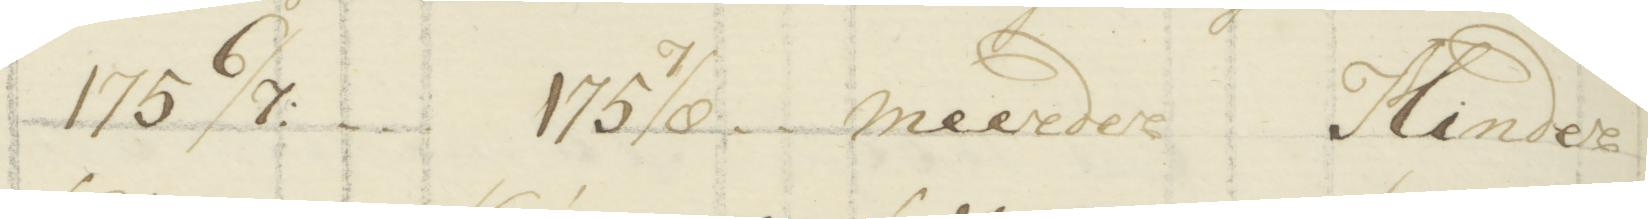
175 6/7: _. 175 7/8 meerder Minder
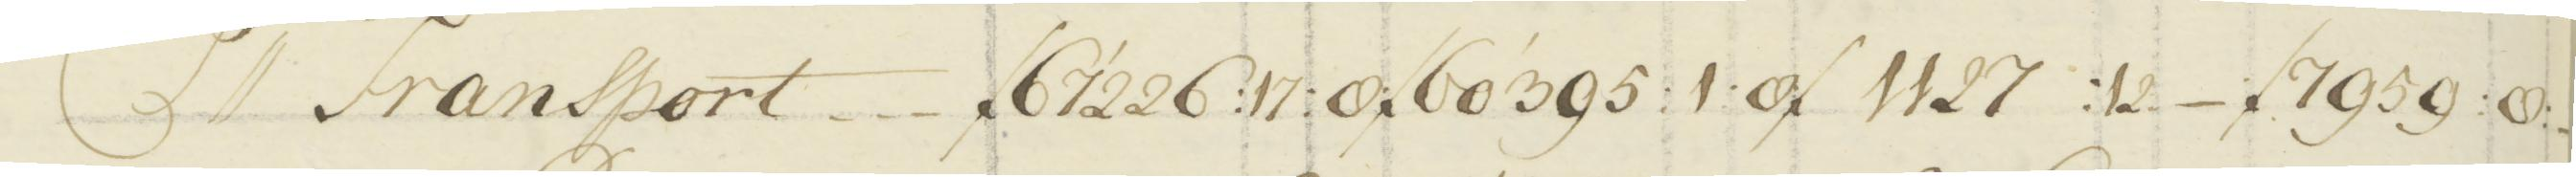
P„r Transport _ _ _ ƒ67'226:17:8 ƒ60'395:1:8 ƒ1127:12:— ƒ7959:8:_
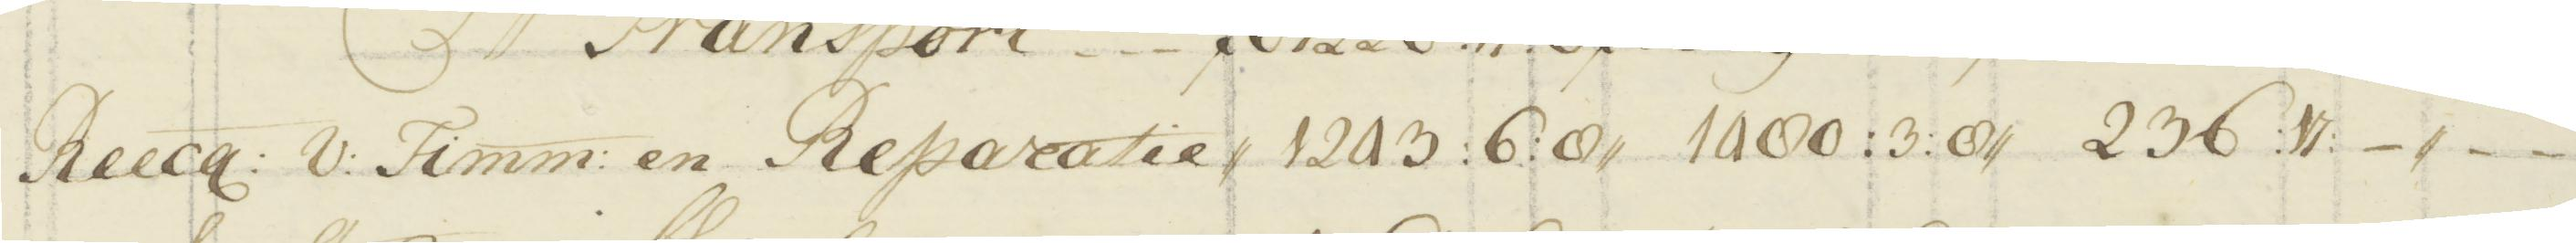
Reecq: v: Timm: en Reparatie „1243:6:8„ 1480:3:8„ 236:17: —„- -
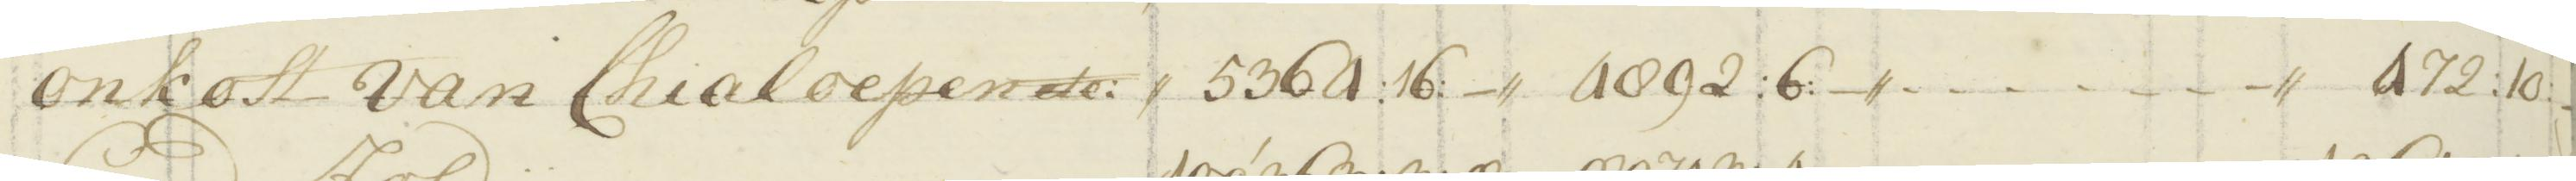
onkost van Chialoepende: „ 5364:16:—„ 4892:6:—„ - - - - - - -„ 472:10:
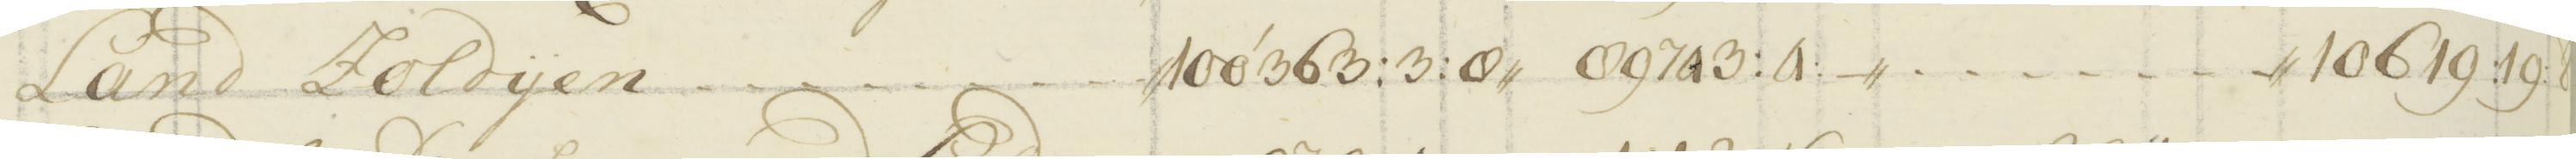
Land Zoldijen - - - - - - - - -„ 100'363:3:8„ 89743:4:—„ . - - - - - -„10619:19:
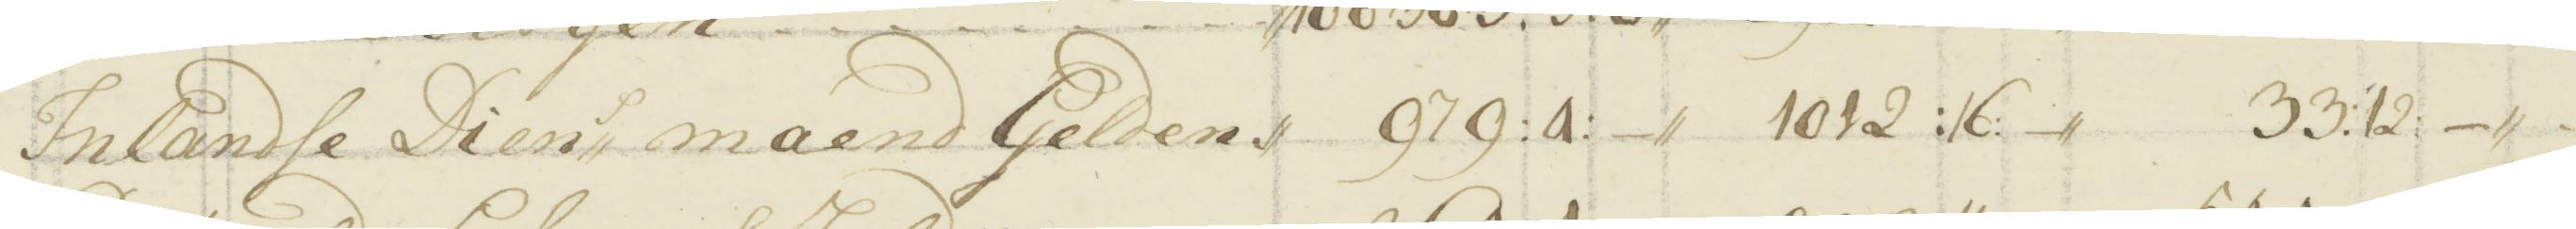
Inlandse Dien„s maend Gelden„ 979: 4: —„ 1012:16:—„ 33:12:—„
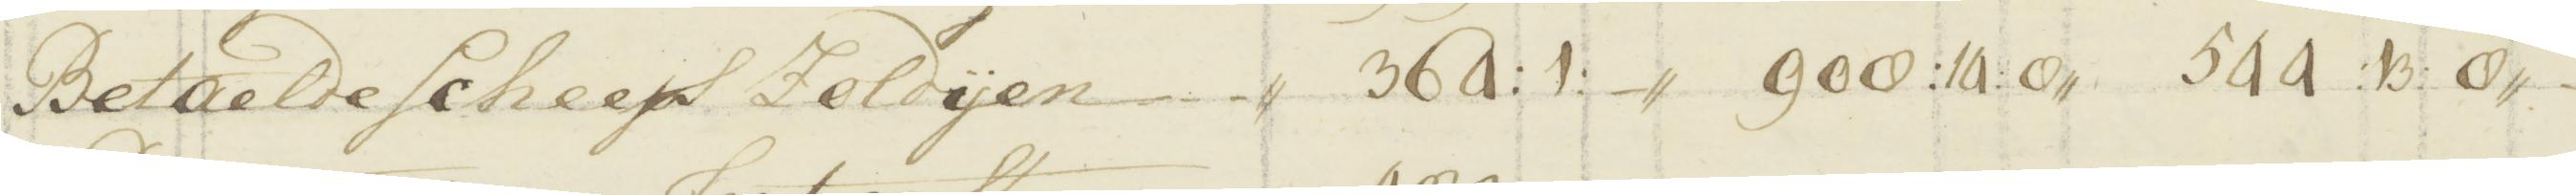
Betaelde scheeps Zoldijen - - -„ 364:1:—„ 908:14:8„ 544:13:8„
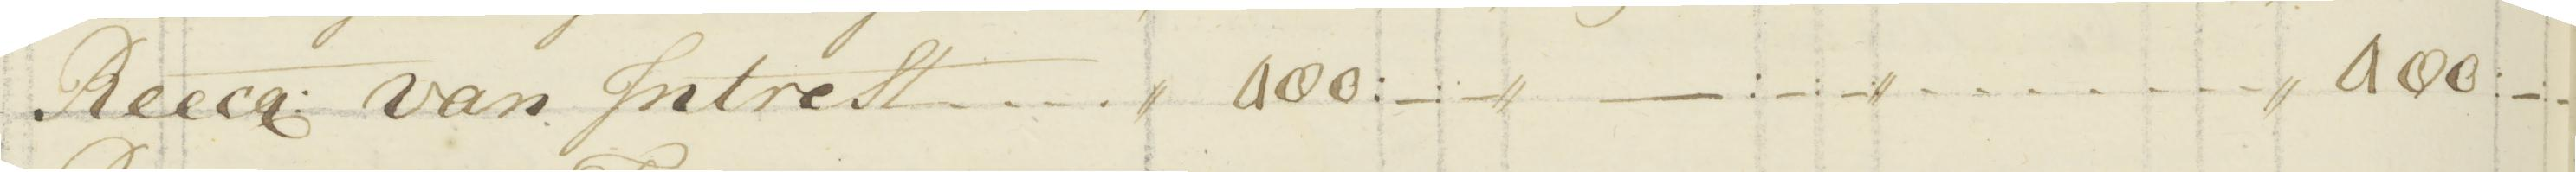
Reecq: van Jntrest - - - . „ 480:—:—„ —:—:—„ - - - - - - - „480:—:—
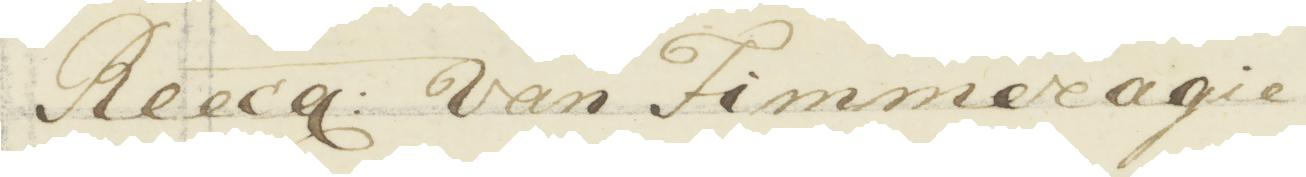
Reecq: van Timmeragie
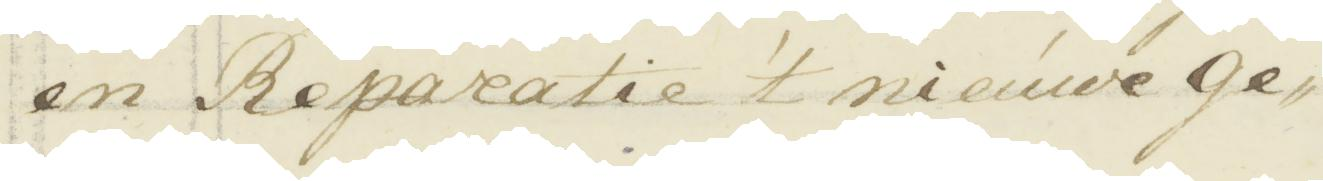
en Reparatie ’t nieuwe ge„
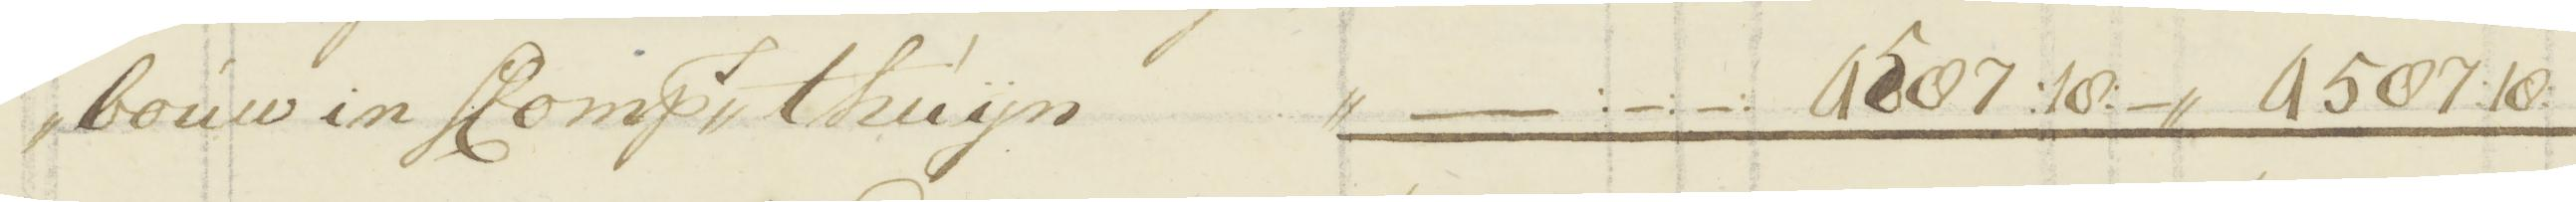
„bouw in sComp„s thuijn „ —:—:— 4587:18:—„ 4587:18:
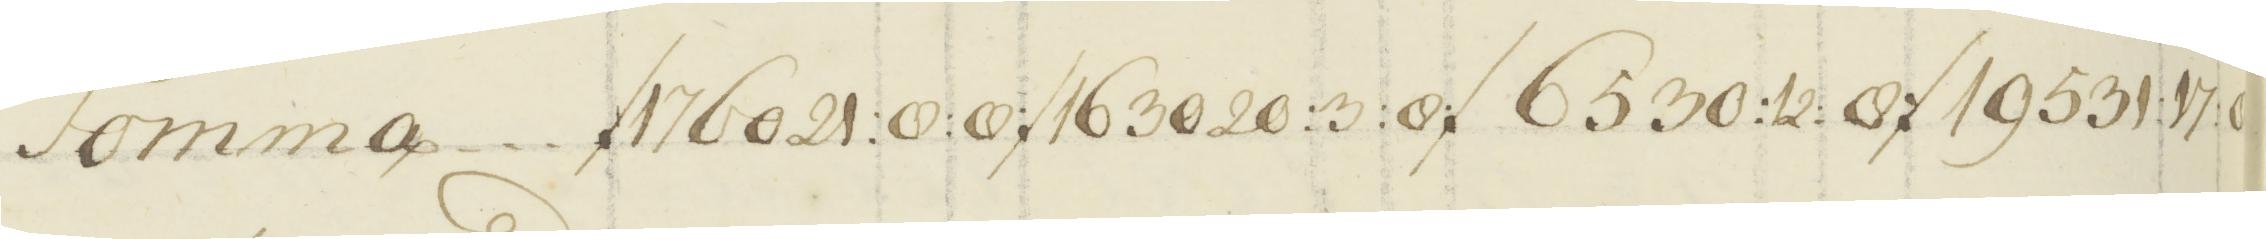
Somma - - -ƒ176021:8:8 ƒ163020:3:8 ƒ6530:12:8 ƒ19531:17:8
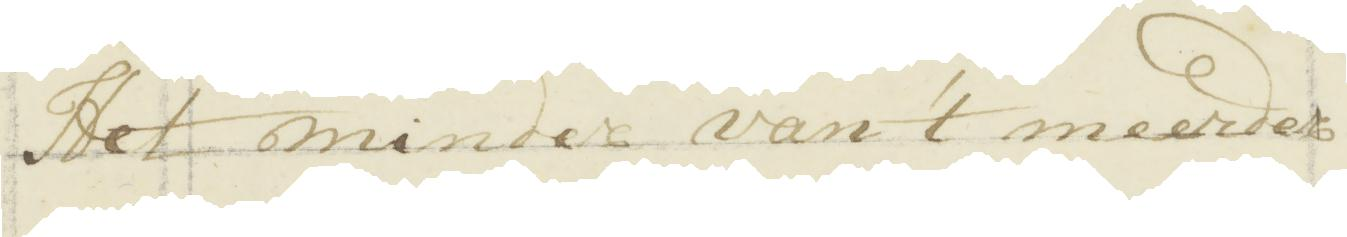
Het minder van ’t meerder
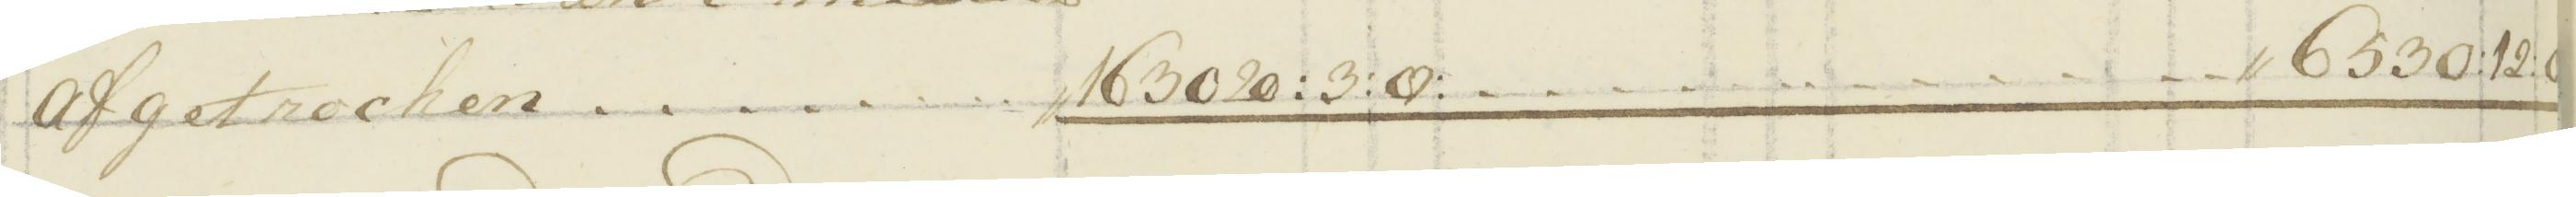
afgetrocken . . . . . . . . „163020:3:8: - - - - - . . - - - - - -„6530:12:
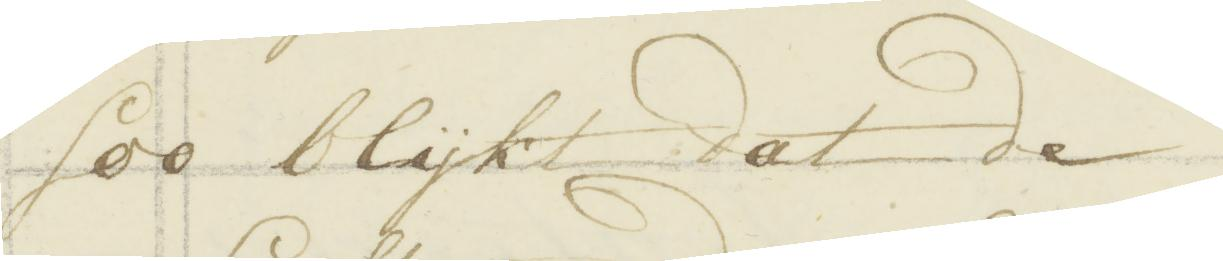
soo blijkt dat de
